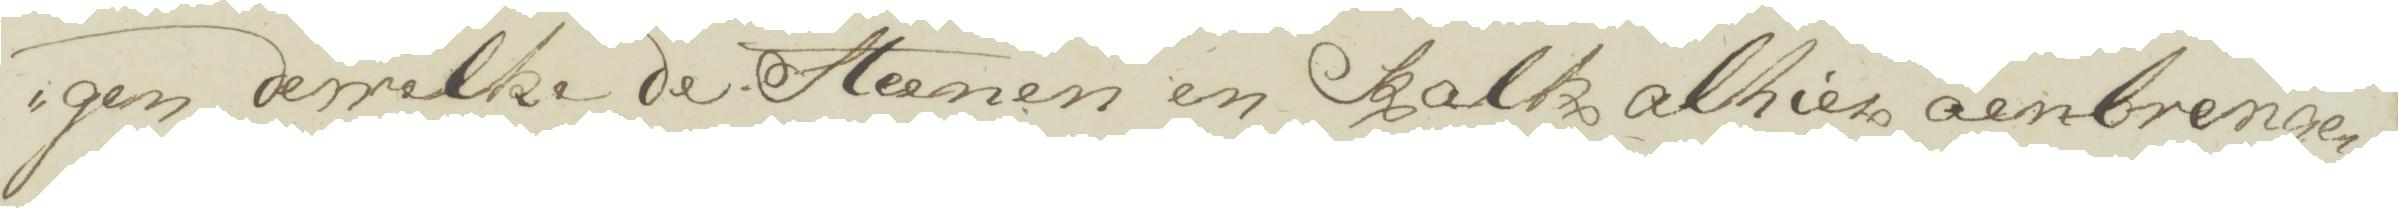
„gen dewelke de steenen en kalk alhier aenbrengen
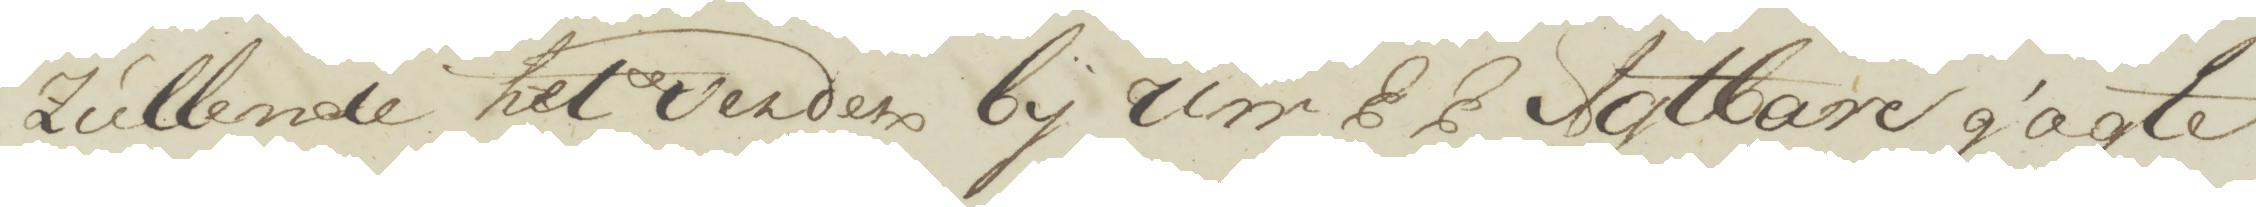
zullende het verder bij uw E E Agtbare g’agte
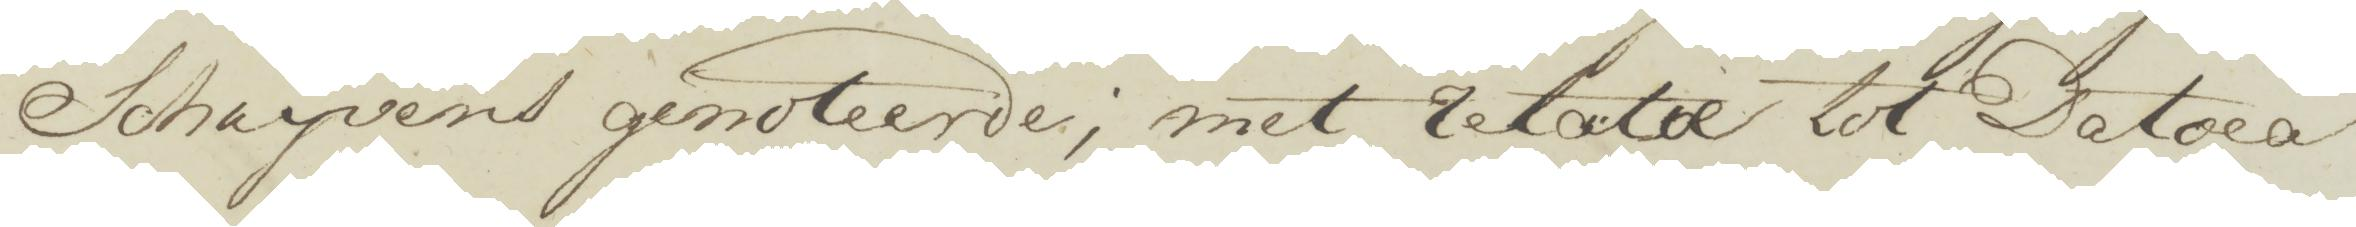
schrijvens genoteerde; met relatie tot Datoea
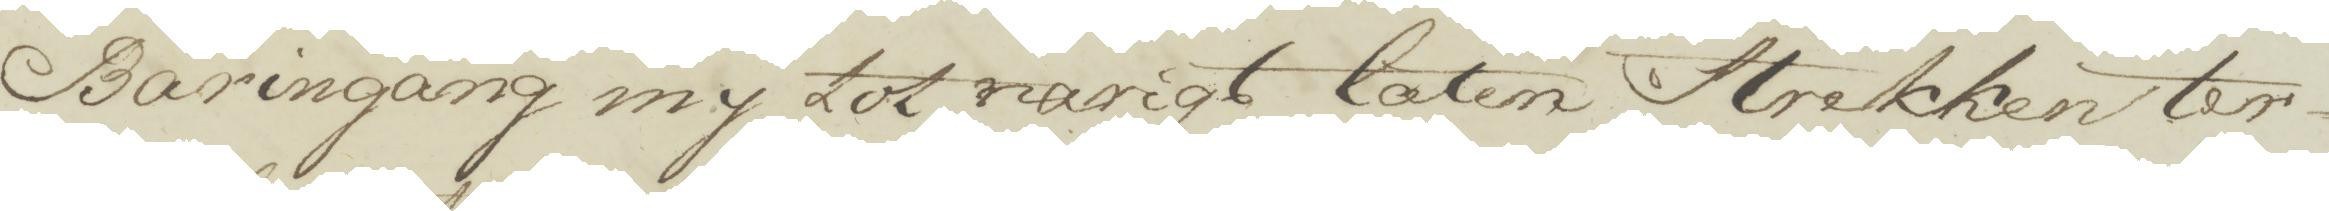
Baringang mij tot narigt laten strekken ter
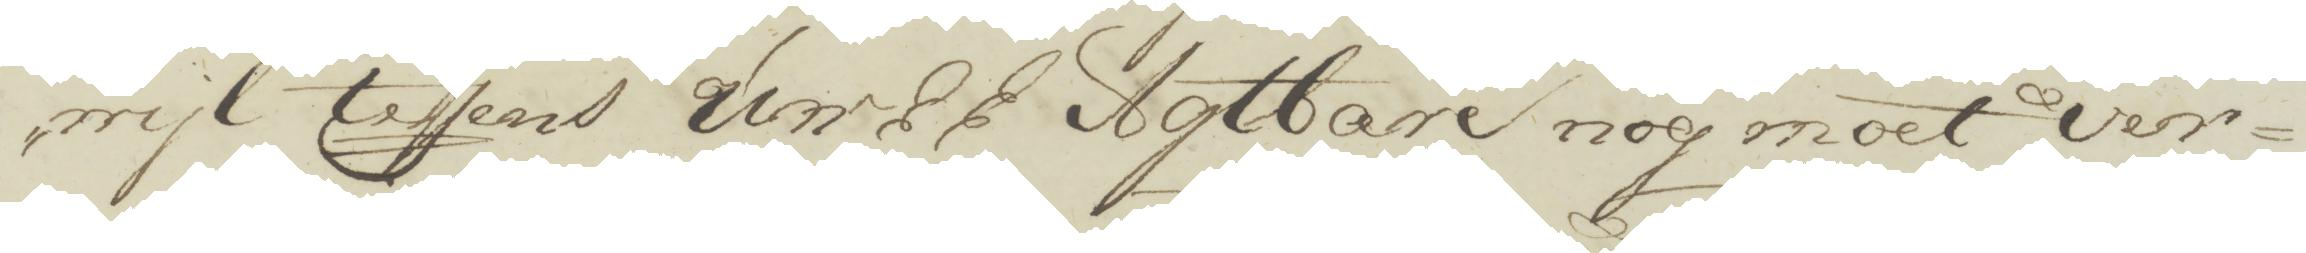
„wijl teffens uw E E Agtbare nog moet ver=
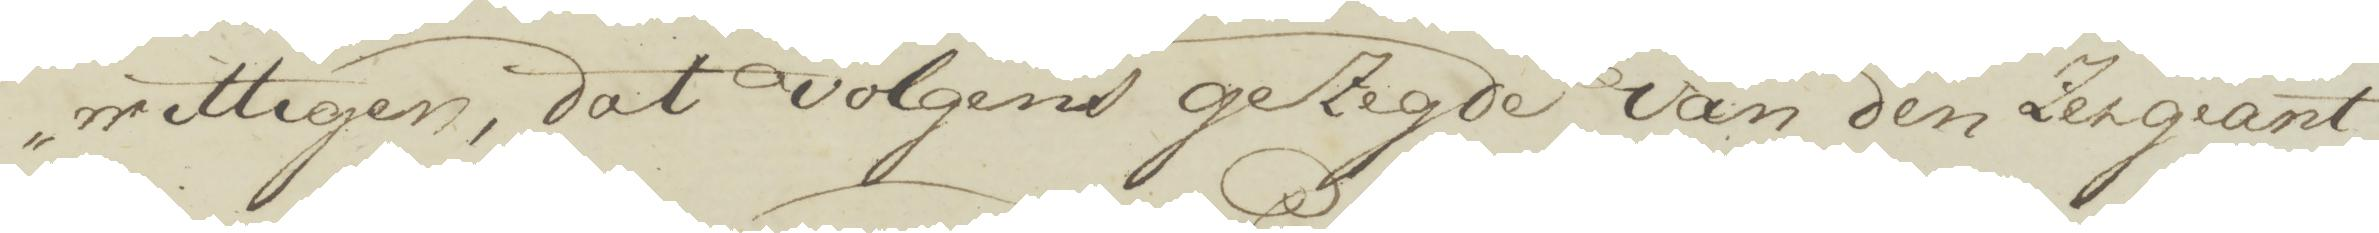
„wittigen, dat volgens gezegde van den zergeant
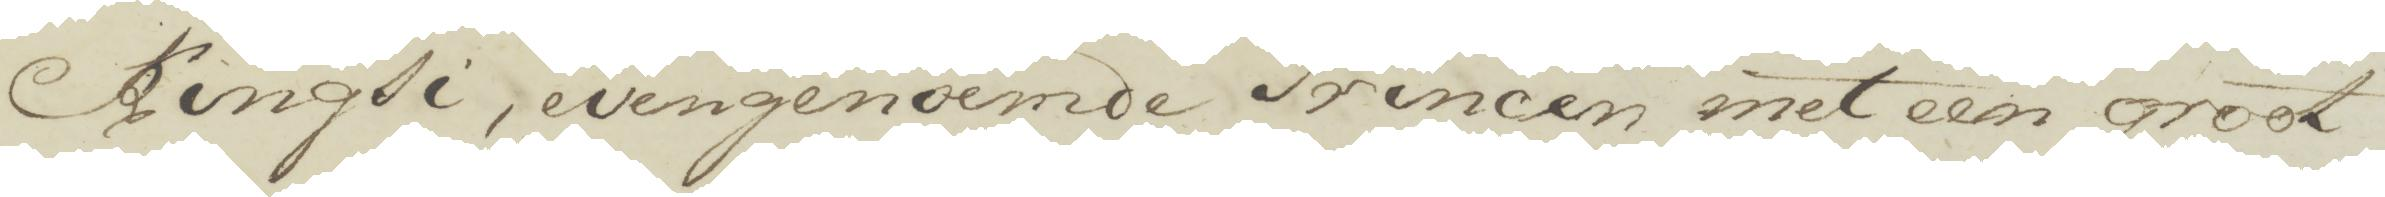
Ringsi, evengenoemde Princen met een groot
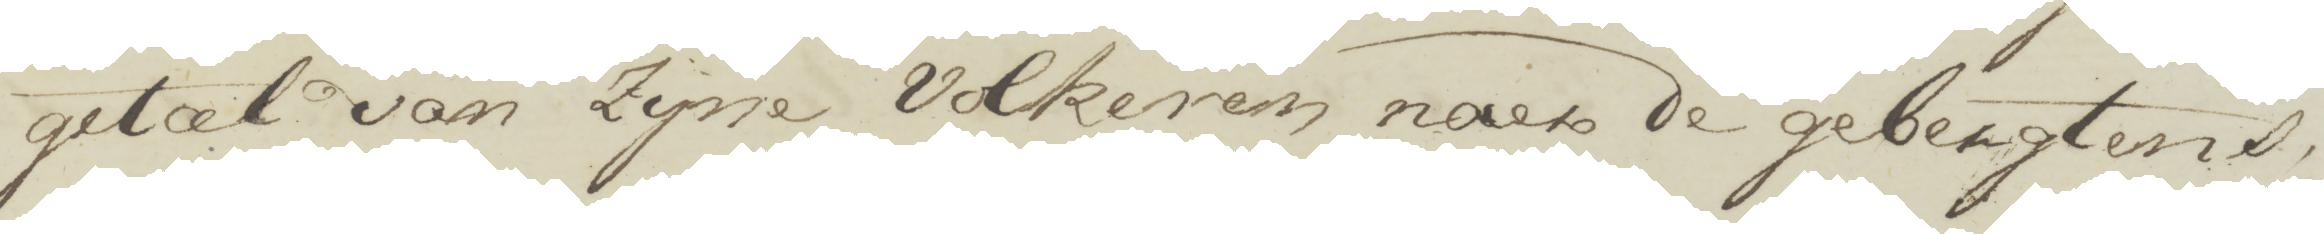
getal van zijne volkeren naer de gebergtens,
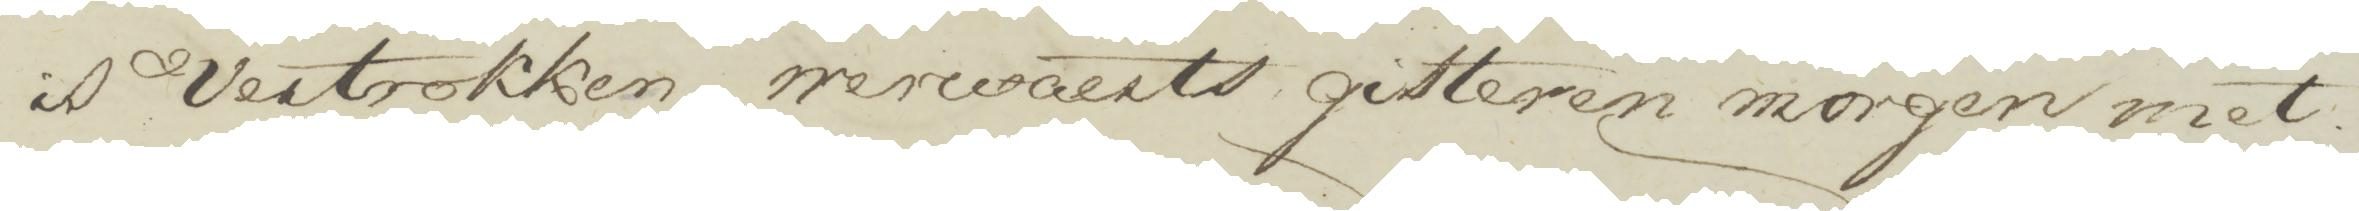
is vertrokken, werwaerts gisteren morgen met
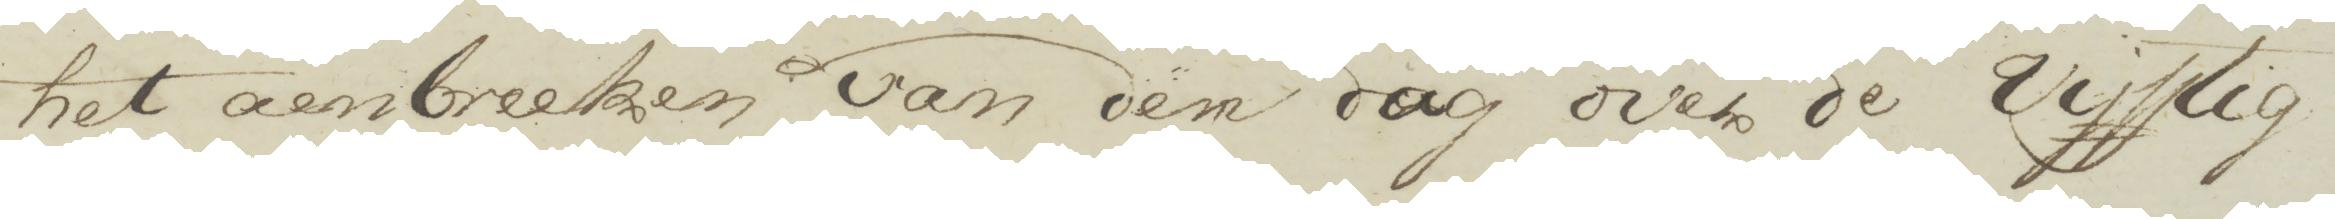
het aenbreeken van den dag over de vijfftig
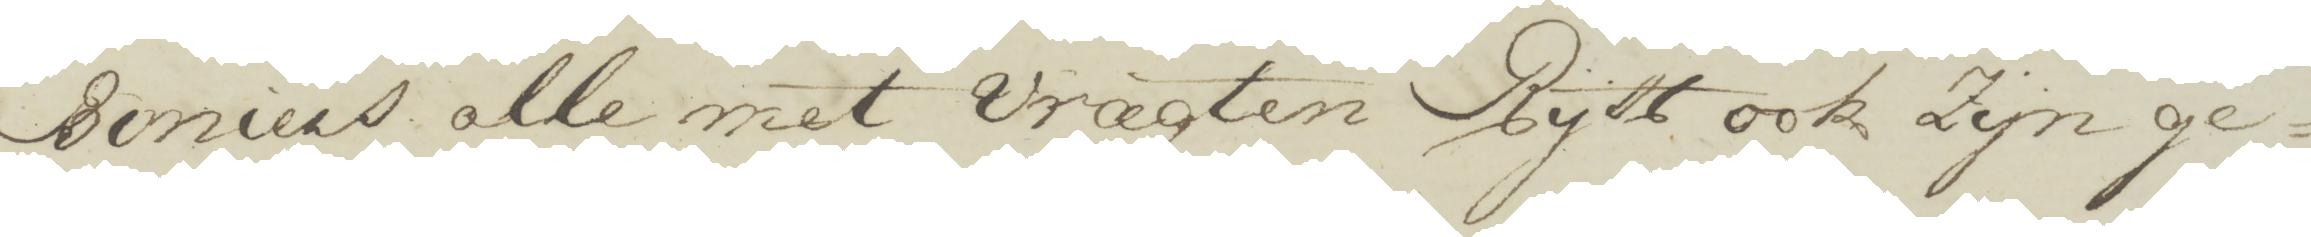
Boniers alle met vragten Rijst ook zijn ge=
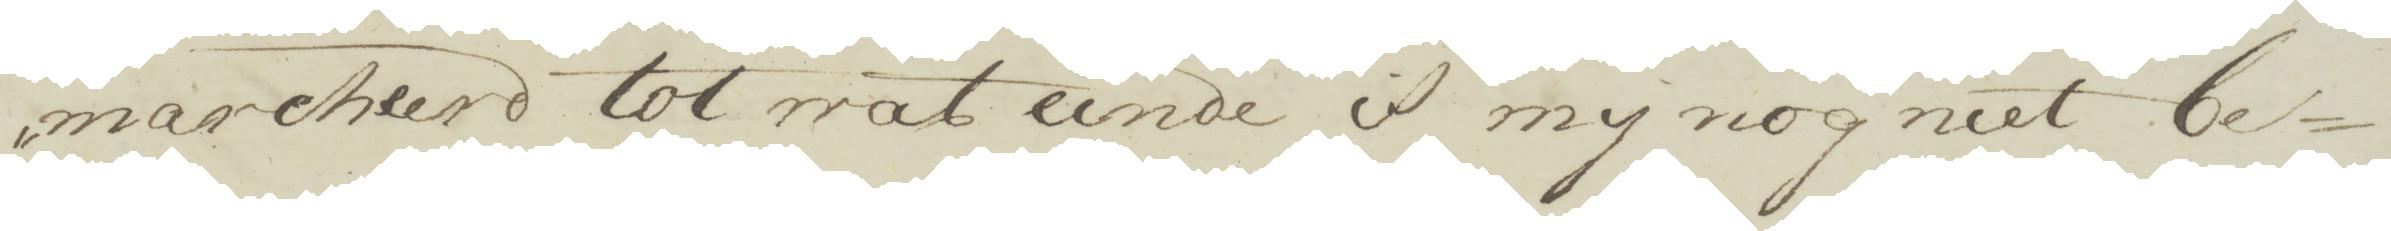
„marcheerd tot wat einde is mij nog niet be=
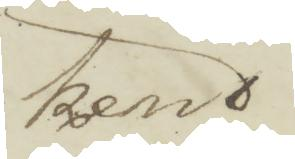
kend
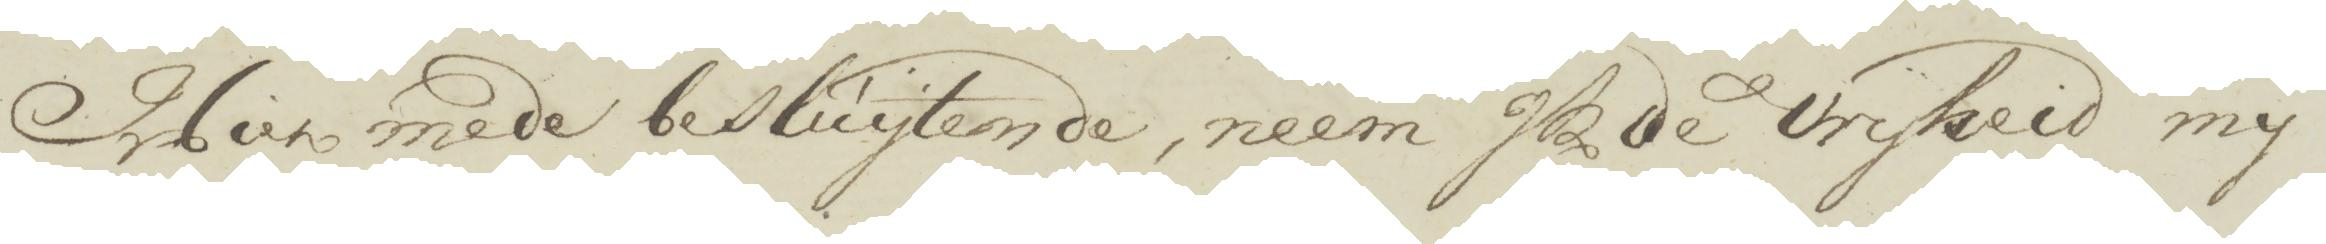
Hier mede besluijtende, neem jk de vrijheid mij
